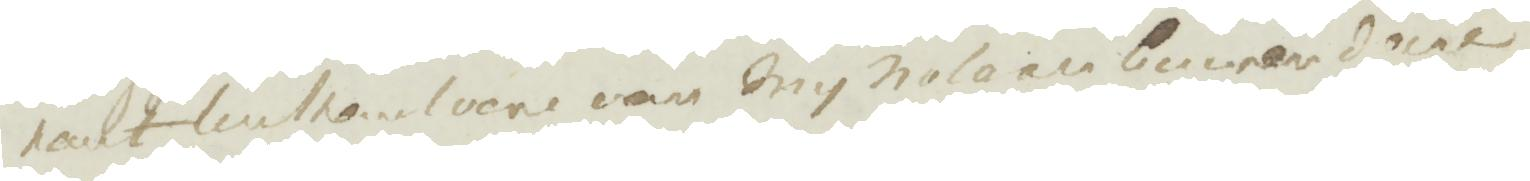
rant ten kantoore van mij notaris binnen deese
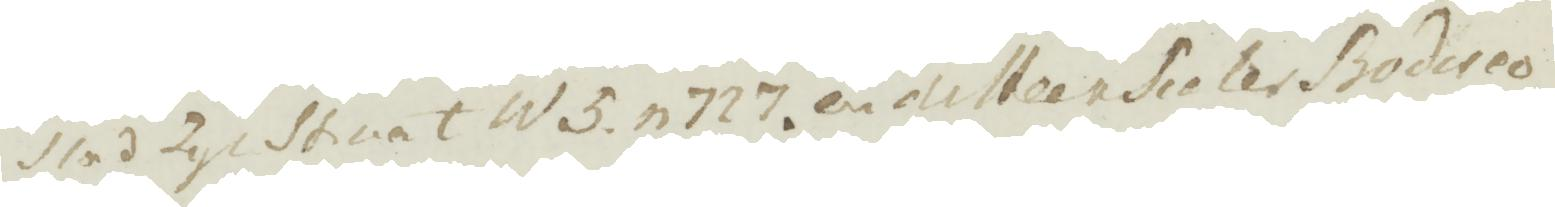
stad Zyl straat W 5. n 727, en de heer Pieter Bodiscco
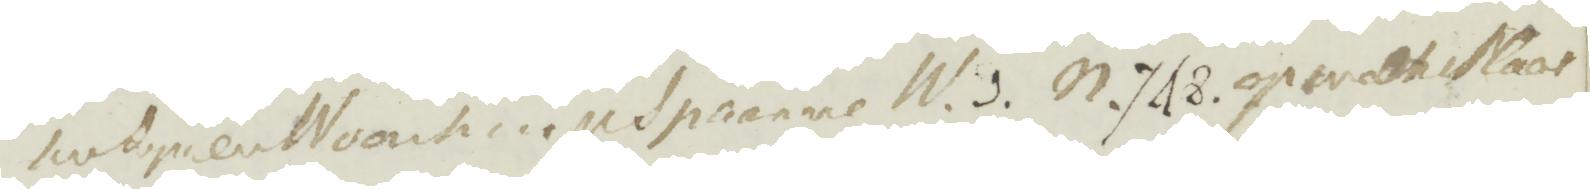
ter Synen Woonhuize Spaarne W.1.n.748 op welk Plaat
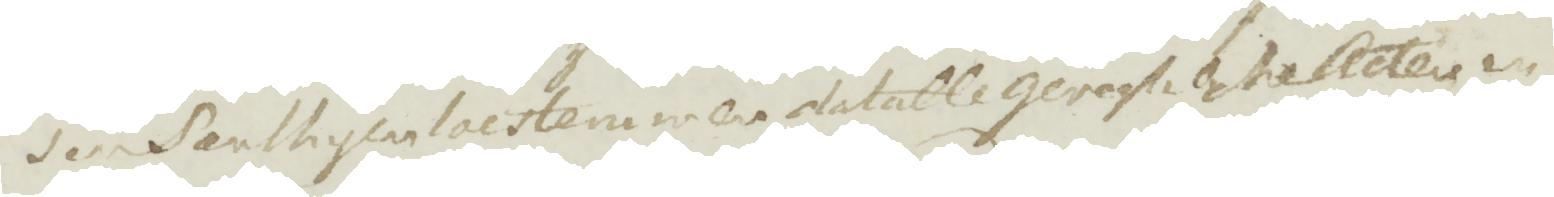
sen Parthyen toestemmen dat alle geregtelijke Acten en
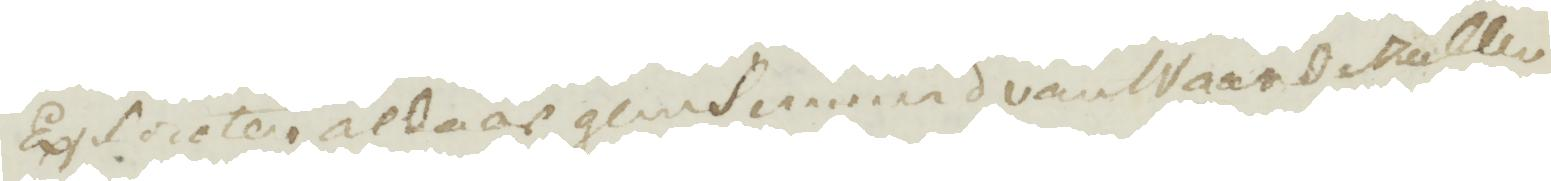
Exploicten aldaar geinsinueerd van waarde zullen
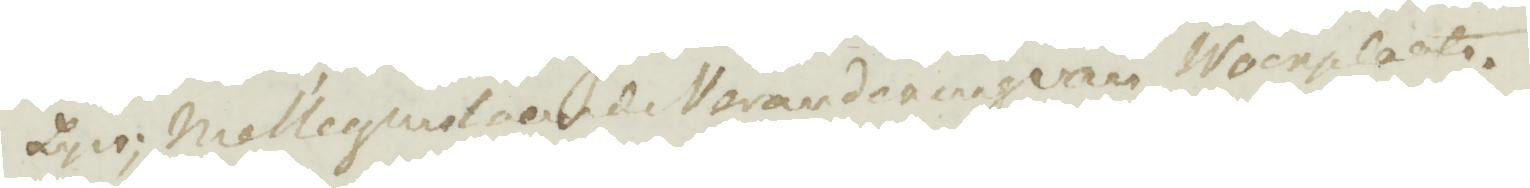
Zyn; Niettegenstaande Verandering van Woonplaats.
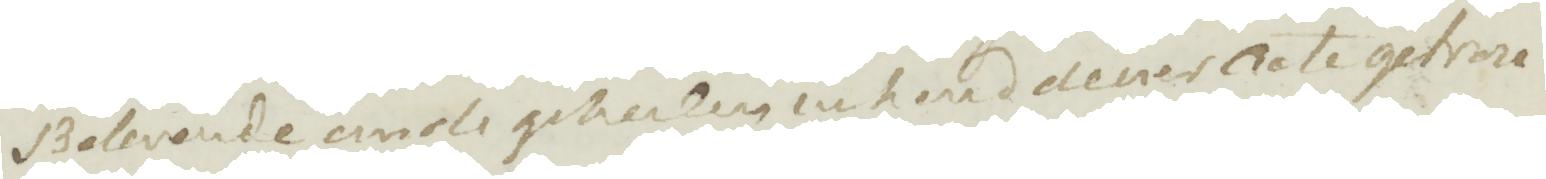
Belovende ondergetekenden deeser Acte getrou
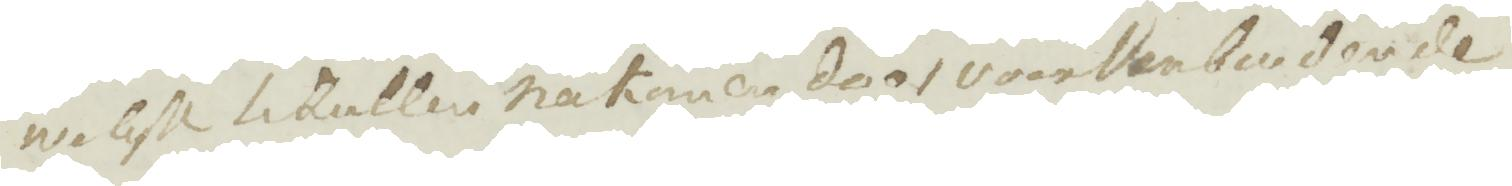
welyk te zullen nakomen, daar voor Verbindende
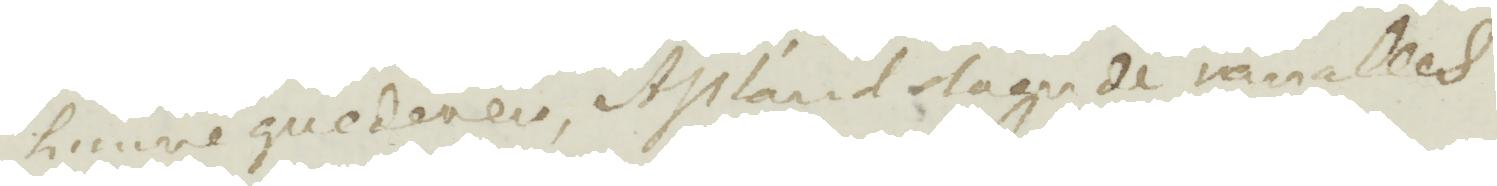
hunne goederen, Afstand doende van alles
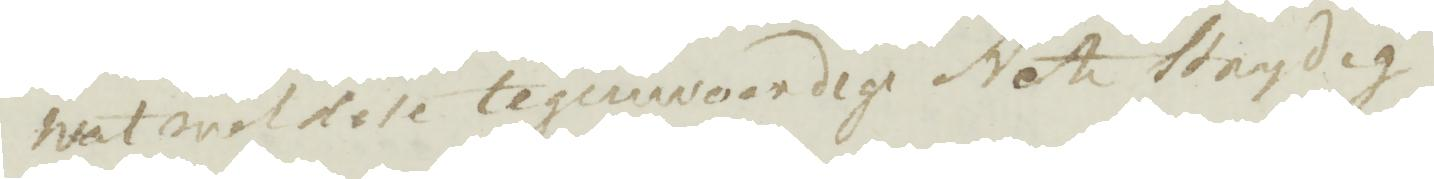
wat met dese tegenwoordige Acte strydig
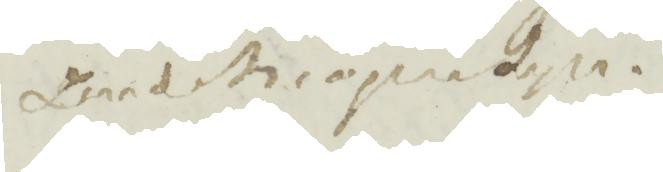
zoude mogen zijn.
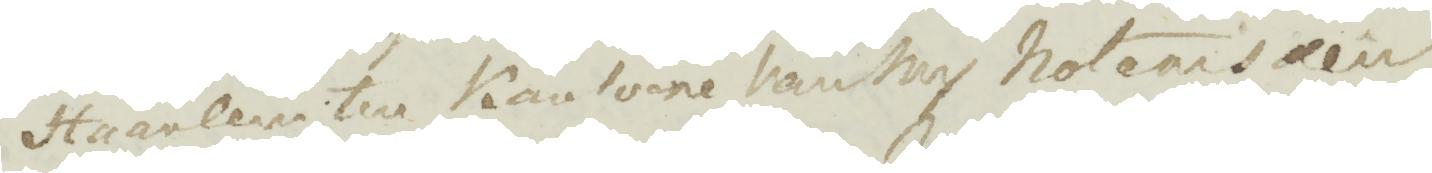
Haarlem ten Kantore van my notaris den
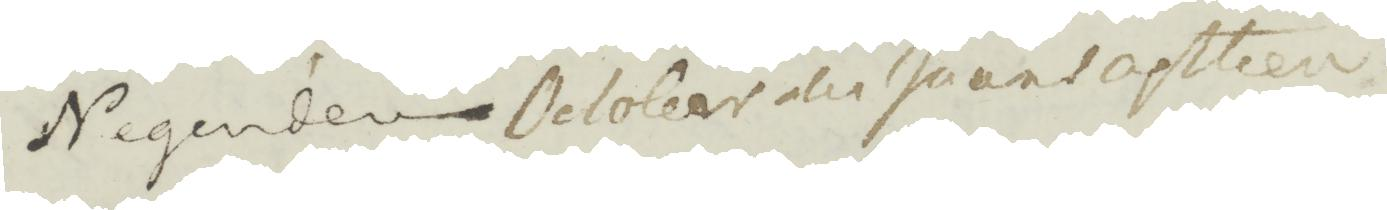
Negenden October des Jaars agttien
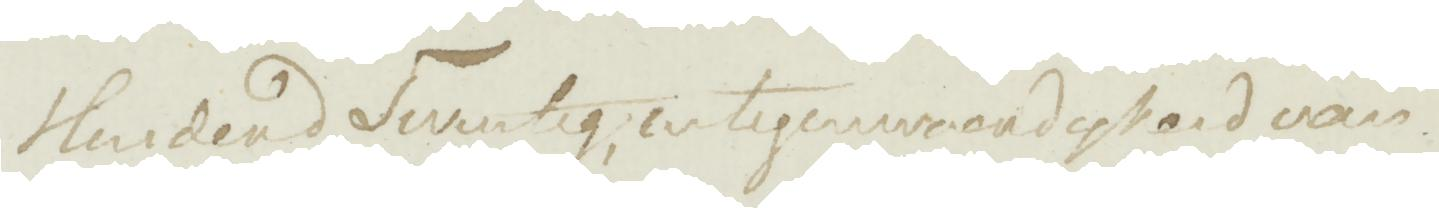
Honderd Twintig, in tegenwoordigheid van
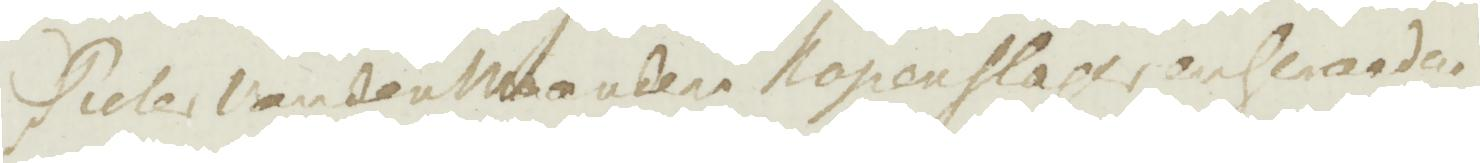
Pieter van der Waarden Koperslager, en Geradus
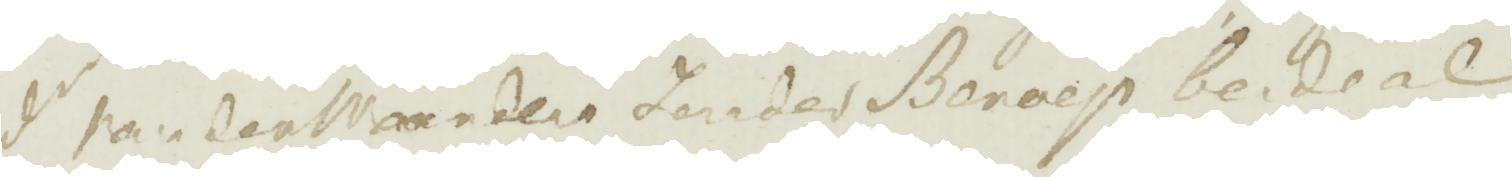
van der Waarden Zonder Beroep beide al
